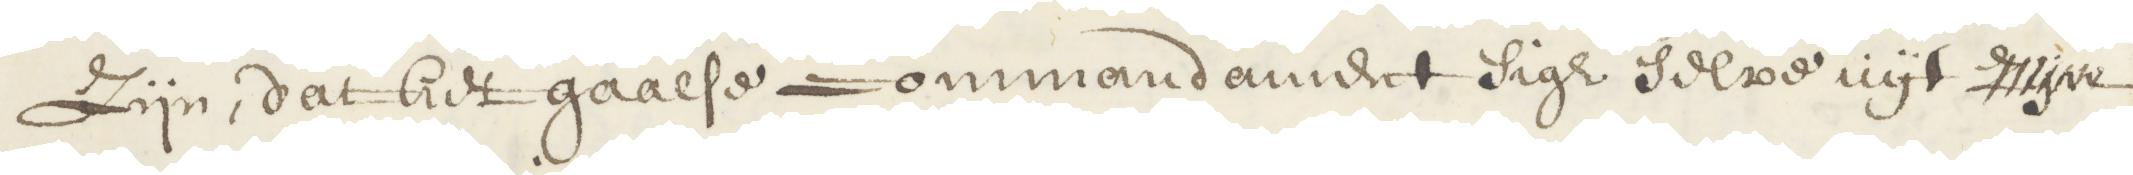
Zijn, dat het gaalse Commandament sigh selve uijt Zijne
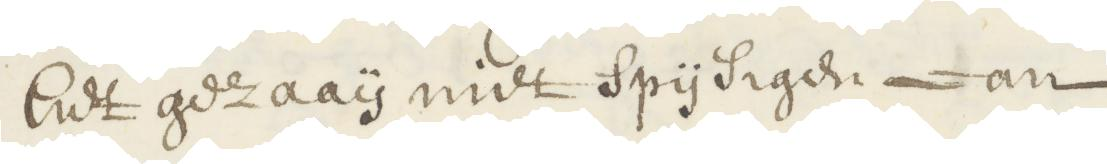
het gezaaij niet Spijsigen Can
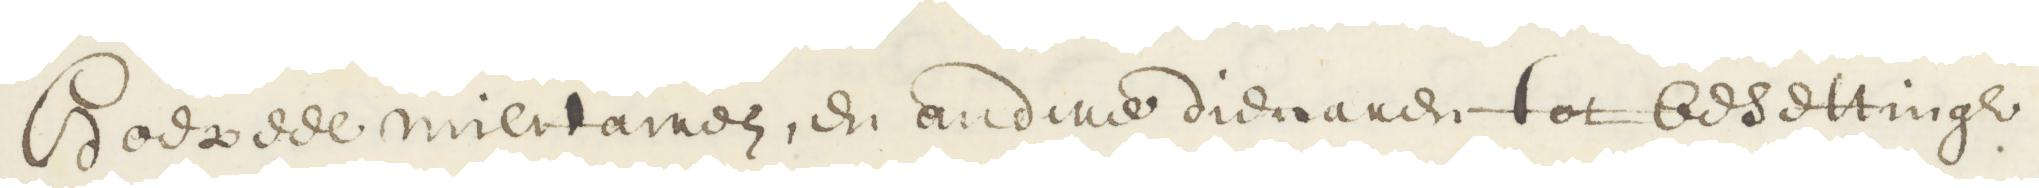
Hoeveel militairen, en andere dienaren tot besettingh
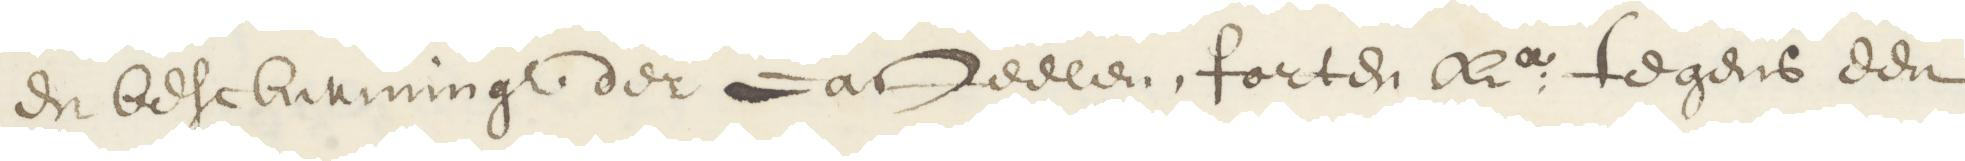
en beschermingh der casteelen, forten &:a tegens een
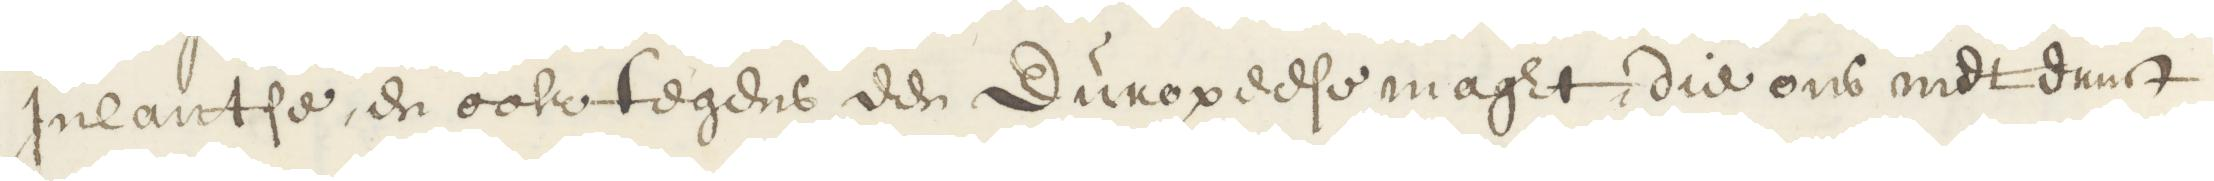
Inlantse, en ook tegens een Europeese maght, die ons met ernst
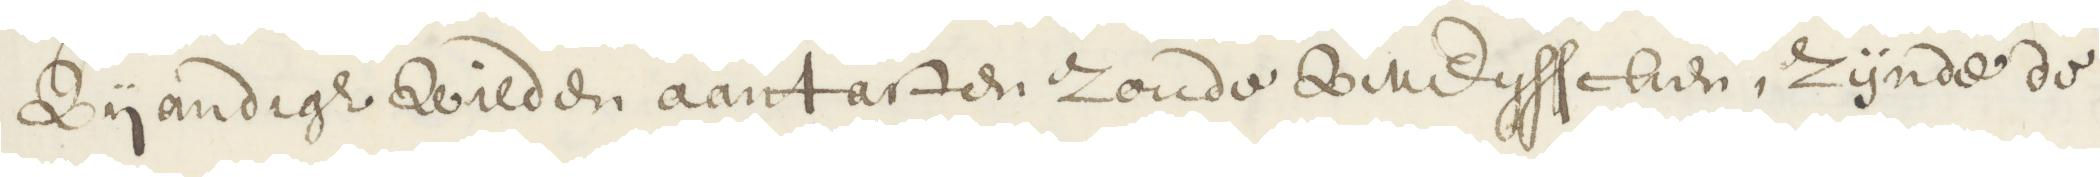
Vijandigh wilden aantasten Zoude vereysschen, Zijnde de
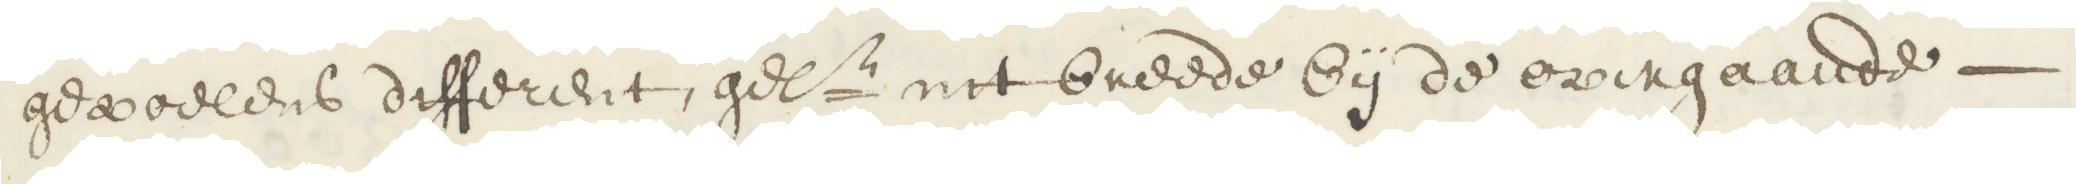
gevoelens different, gelijk in't breede bij de overgaande —
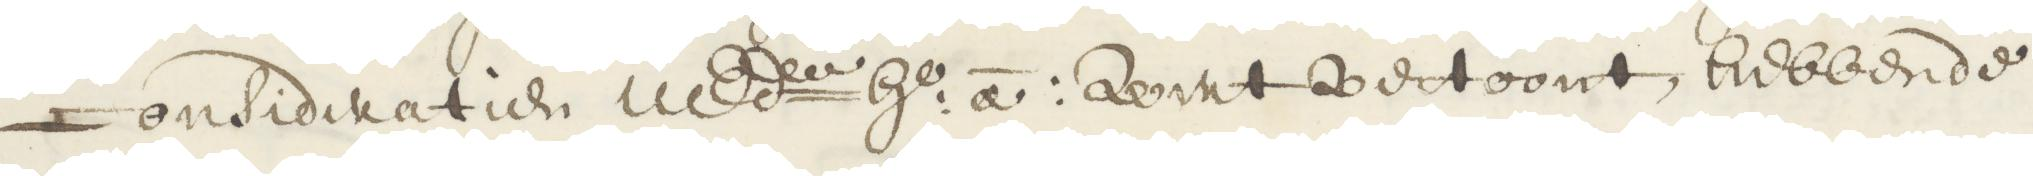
consideratien UEd=le h:e a: wirt vertoont, hebbende
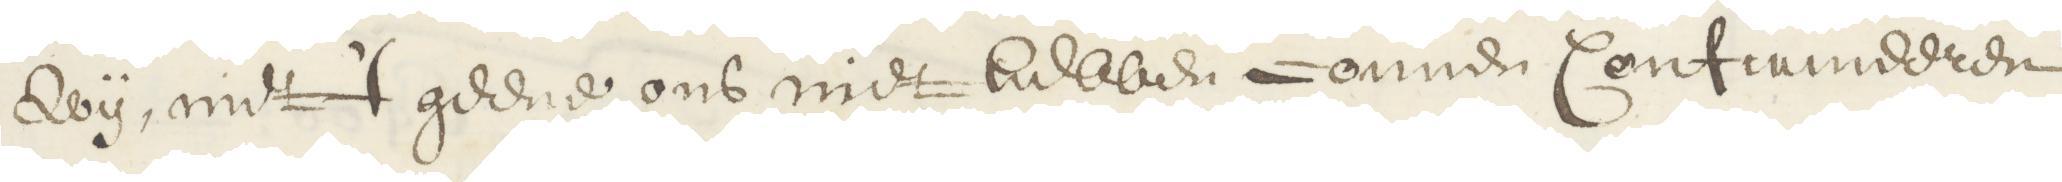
wij, niet ’t geene ons niet hebben connen Confirmeeren
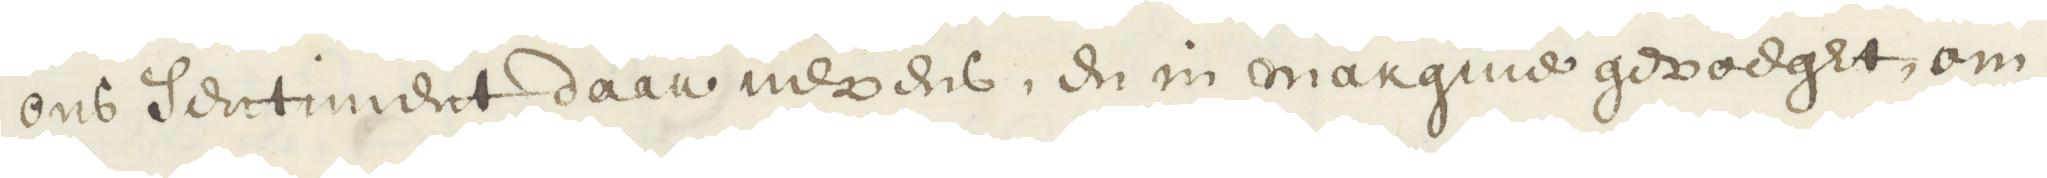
ons Sentiment daar nevens, en in margine gevoeght, om
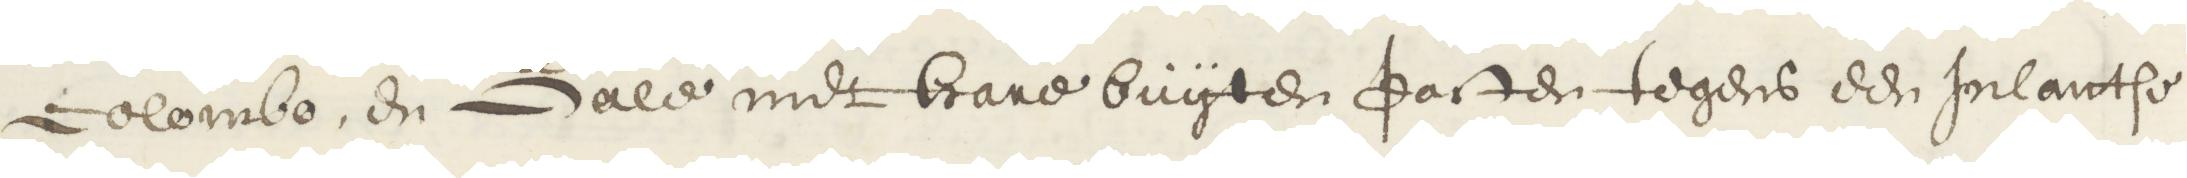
Colombo, en Gale met hare buijten posten tegens een Jnlantse
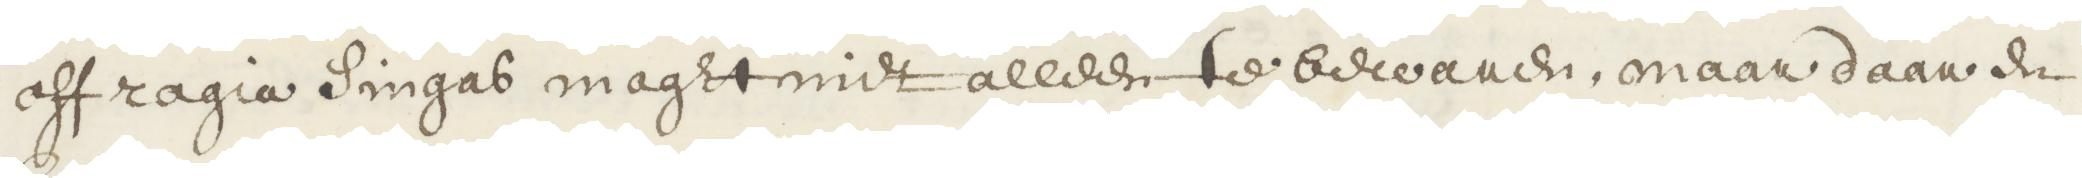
off ragia Singas maght niet alleen te bewaren, maar daar en
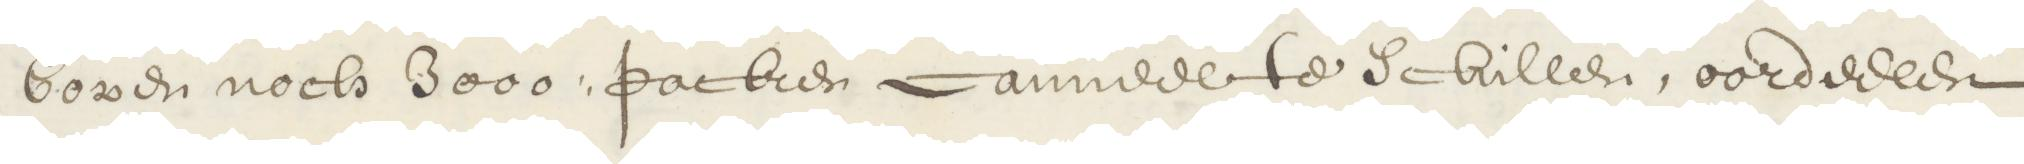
boven noch 3000: packen canneel te schillen, oordeelen
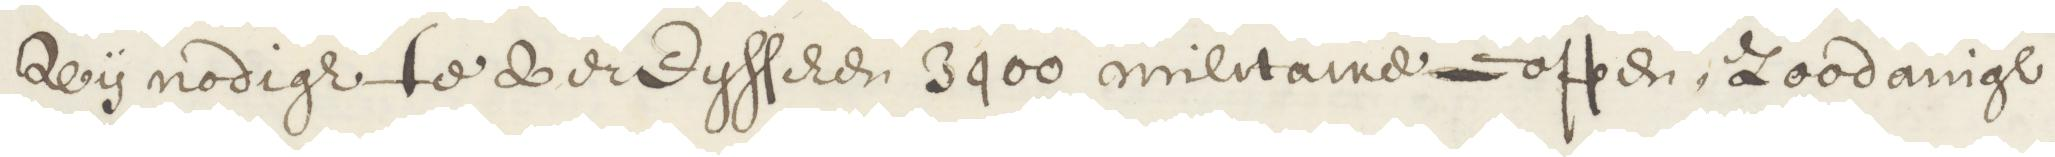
wij nodigh te vereysschen 3400 militaire coppen, Zoodanigh
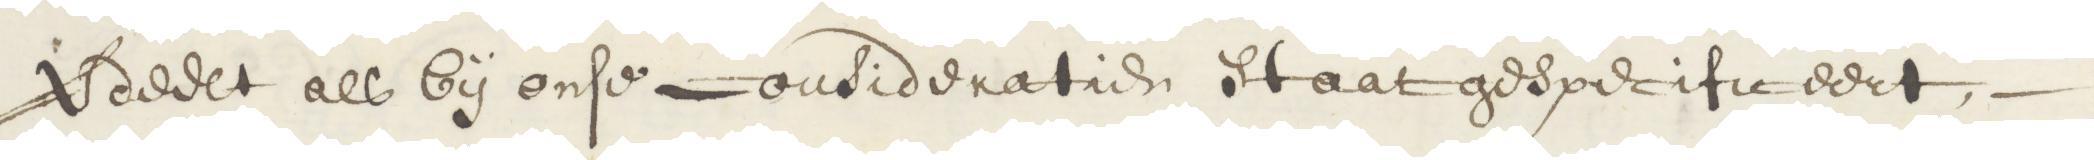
verdeelt als bij onse consideratien staat gespecificeert, —
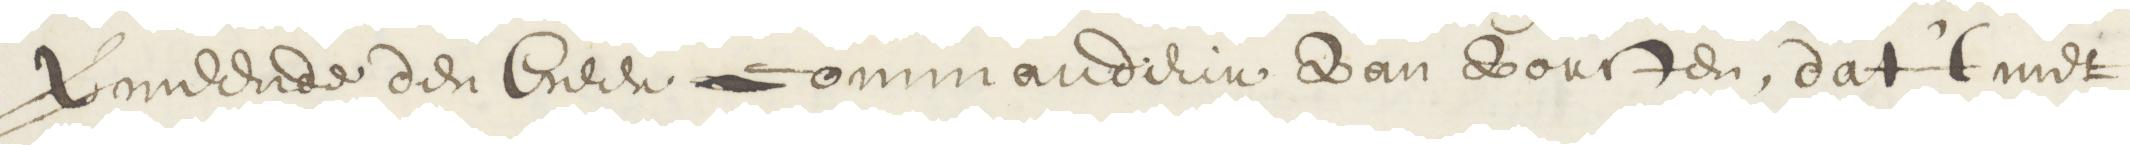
vermeende den heer commandeur van vorsten, dat ’t met
